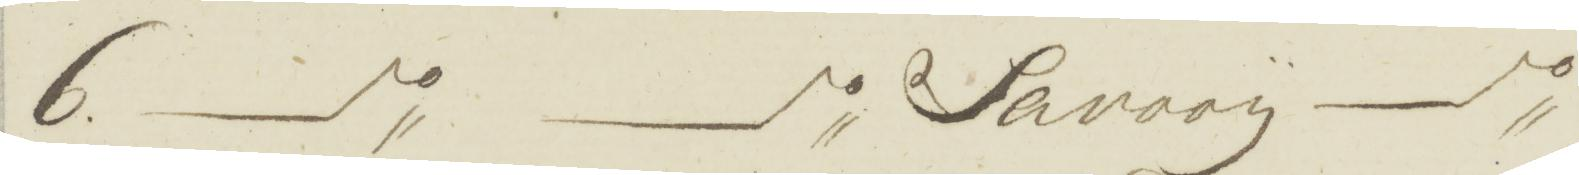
6. _„o _„o savooij _„o
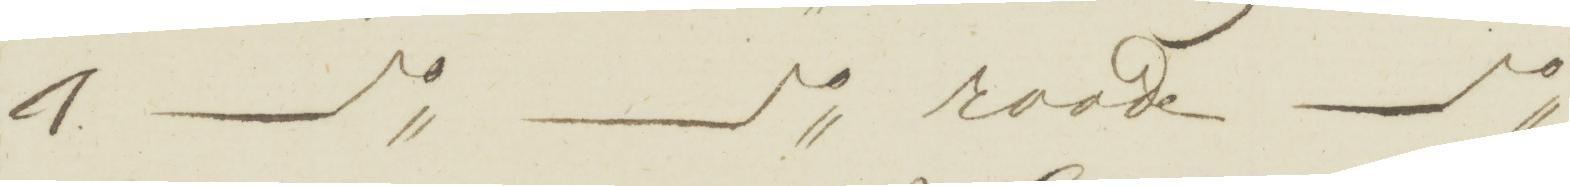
4. _„o _„o roode _„o
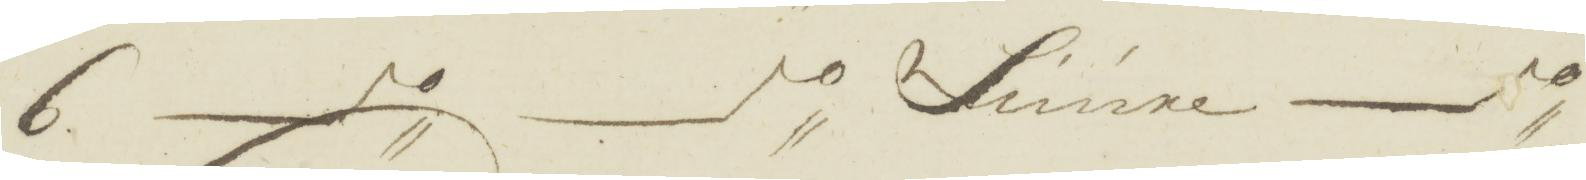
6. _„o _„o suure _„o
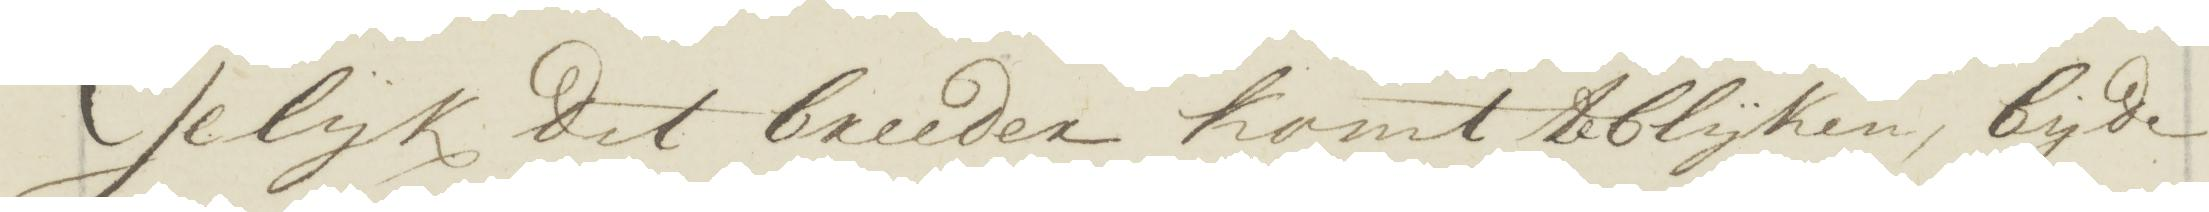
Gelijk dit breeder komt te blijken, bij de
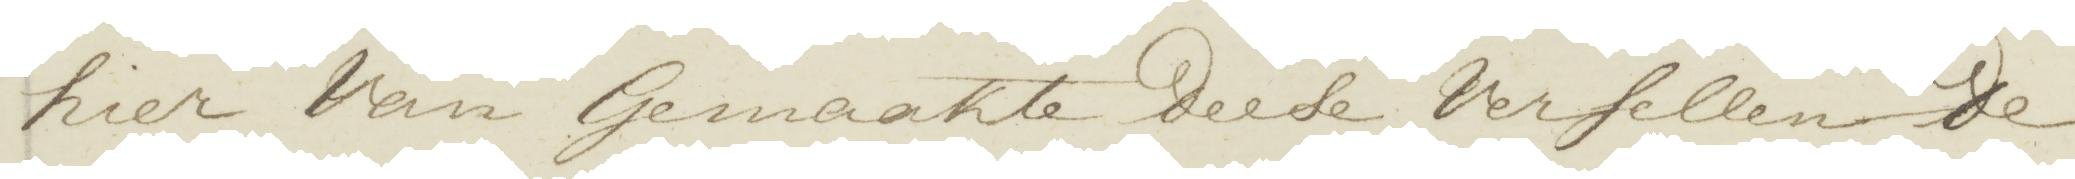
hier van Gemaakte deese versellen de
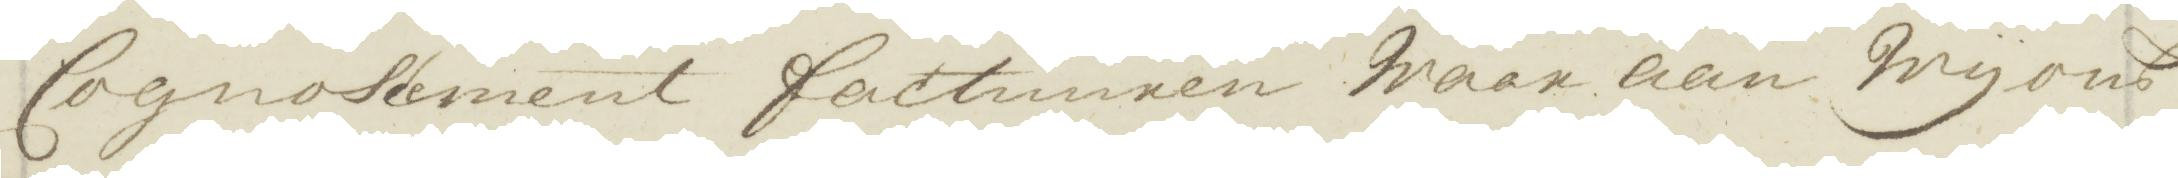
Cognoscement factuuren waar aan wij ons
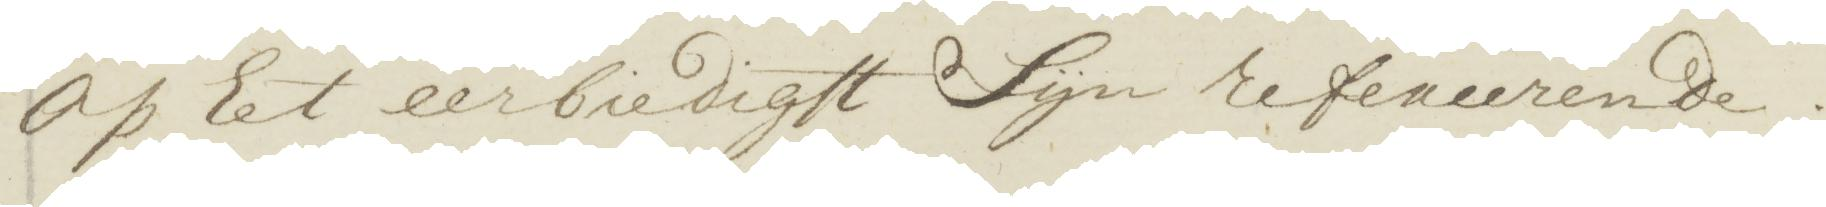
op het eerbiedigst sijn refereerende.
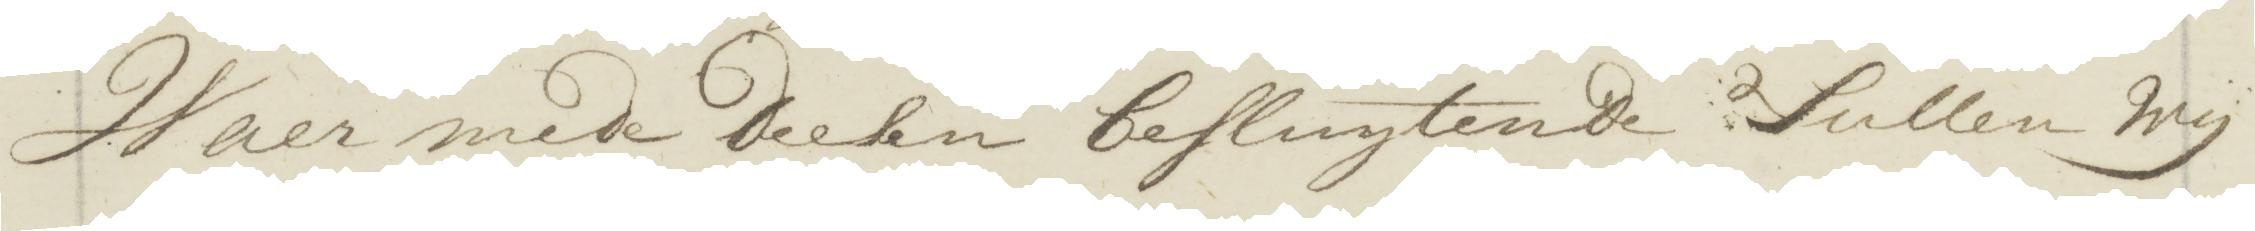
Waer mede deesen besluijtende sullen wij
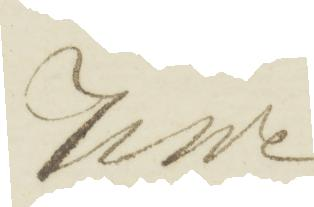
Uwe
